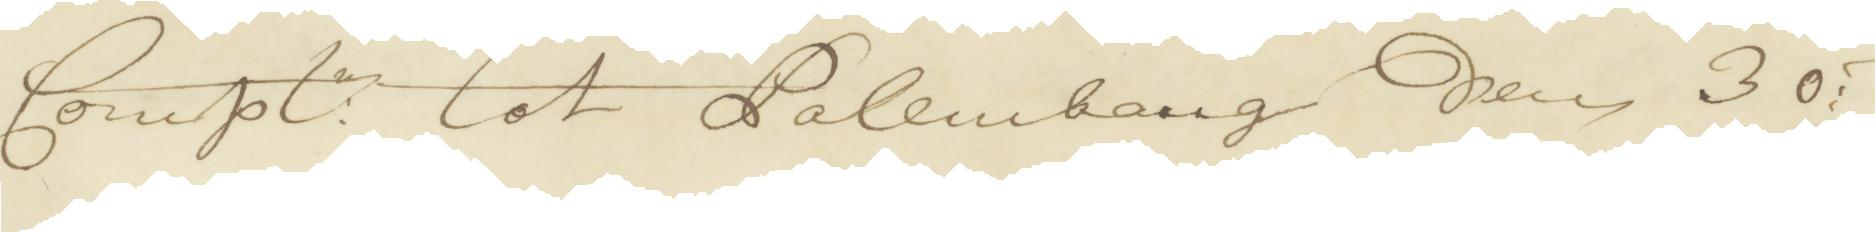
Compt:r tot Palembang den 30:'
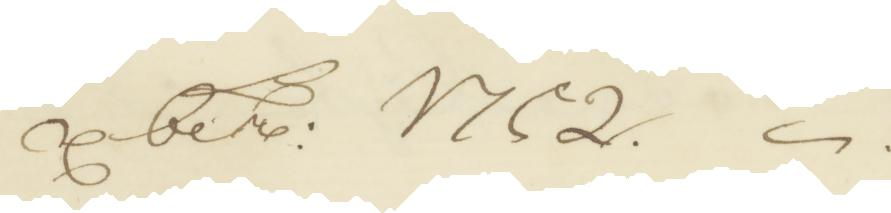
xber: 1752. —
